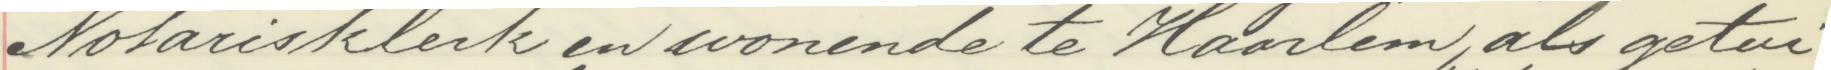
Notarisklerk en wonende te Haarlem, als getui
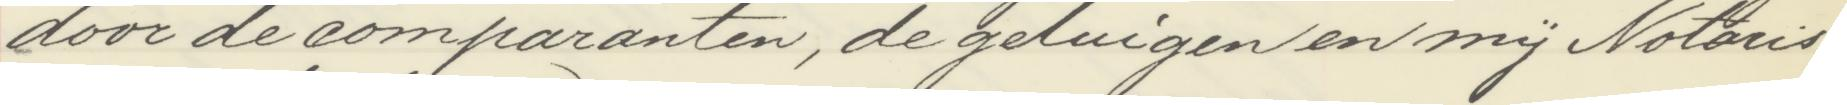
door de comparanten, de getuigen en mij Notaris
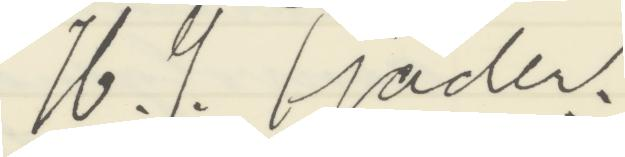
H.J. Tjaden:
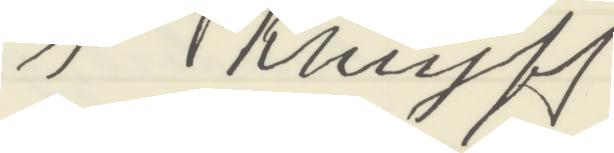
F Kruijff
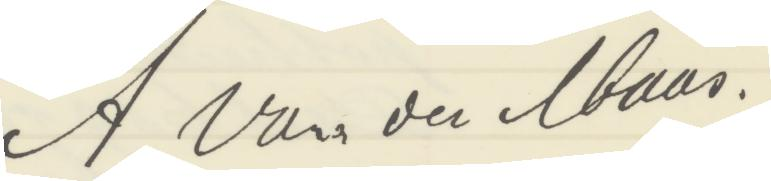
A Van der Maas.
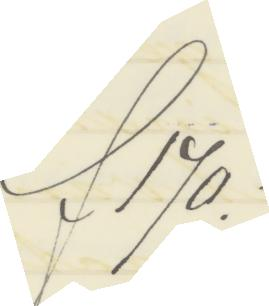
ƒ 170.
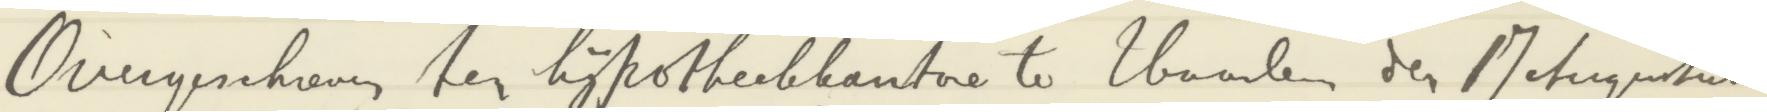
Overgeschreven ten hijpotheekkantore te Haarlem den 17 Augustus
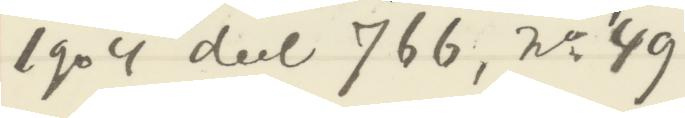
1904 deel 766, n:o 79
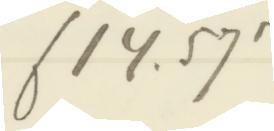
ƒ 14.575
